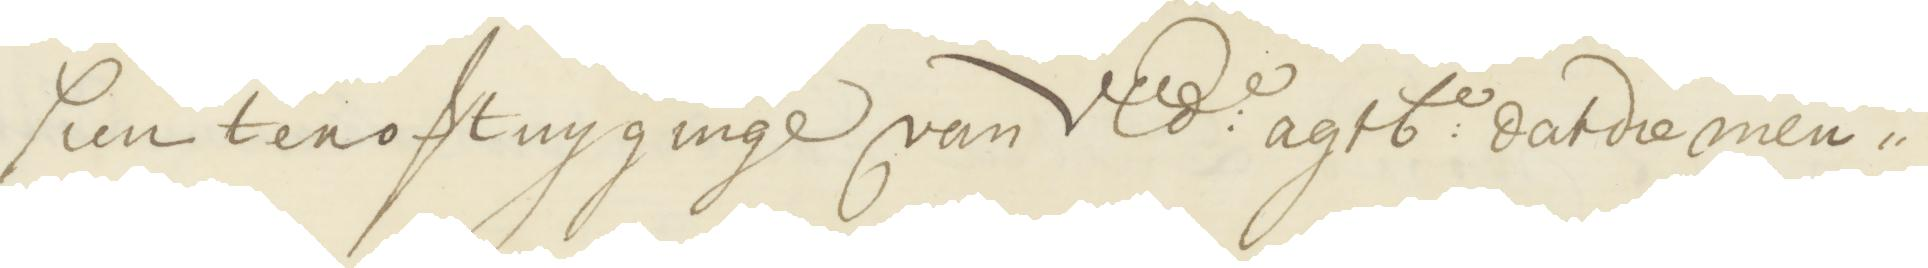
Sien ter overtuyginge van VEd:e agtb:e dat die men„
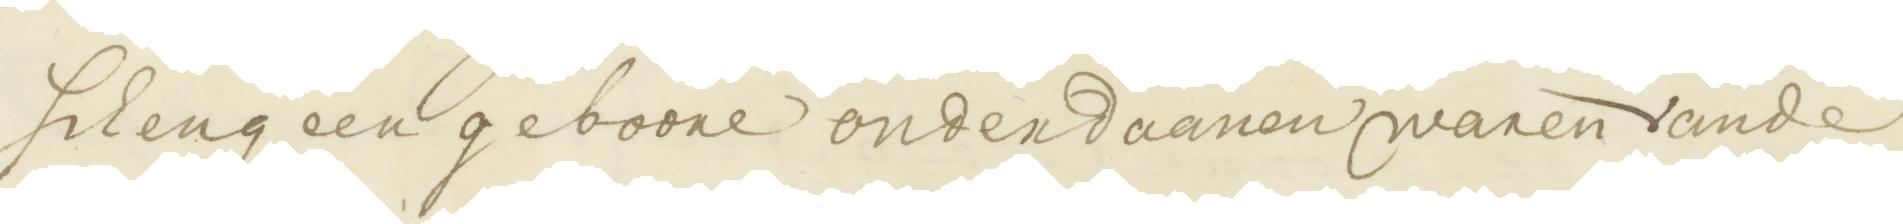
schen geen geboore onder daanen waren vande
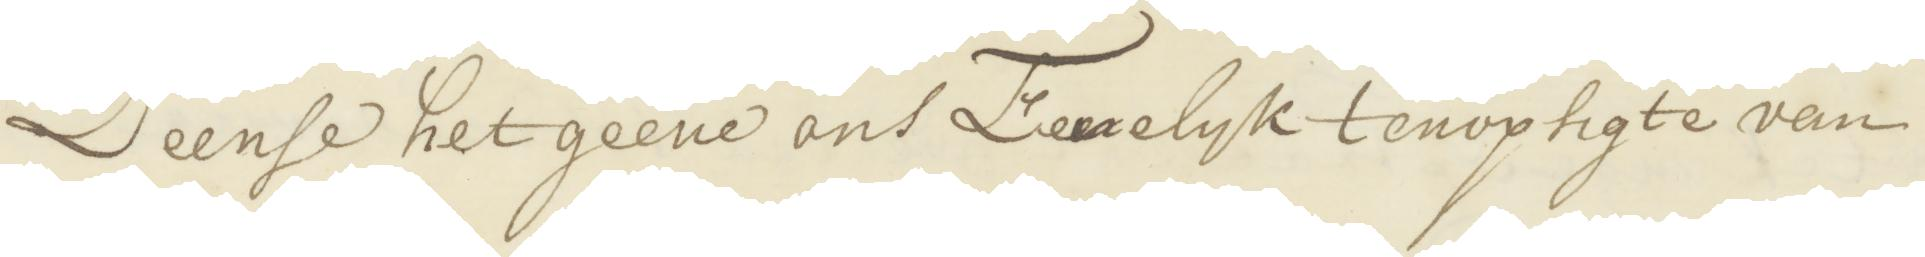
Deense het geene ons Eerelyk tenopsigte van
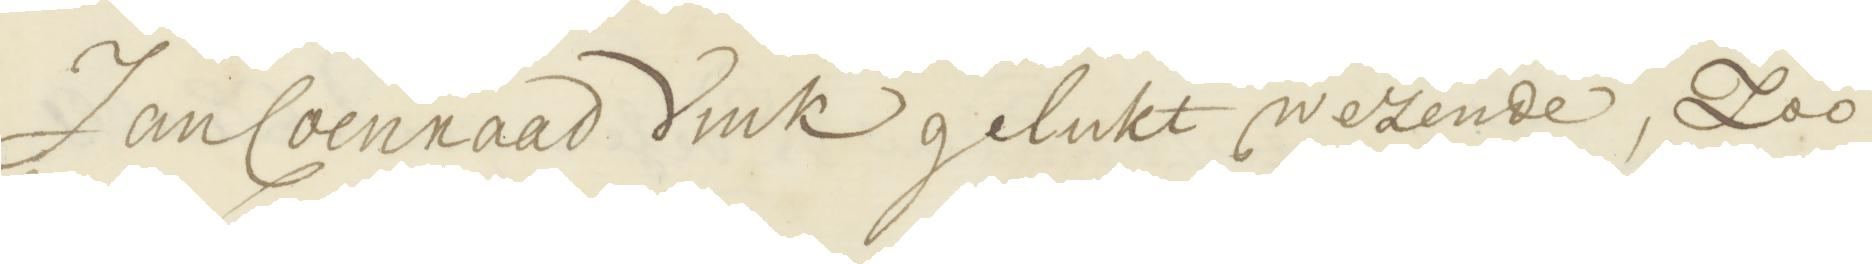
Jan Coenraad Vink gelukt wezende, Zoo
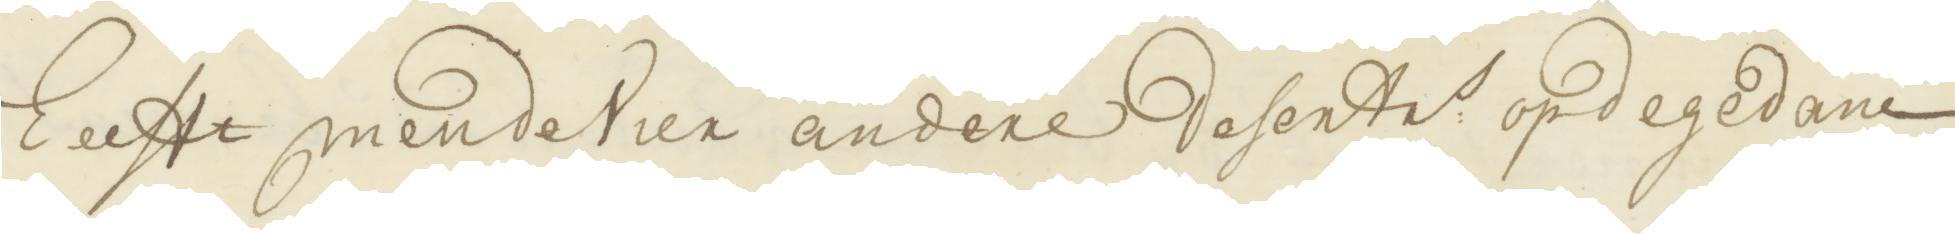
heefft mende Vier andere desertr:s op de gedane
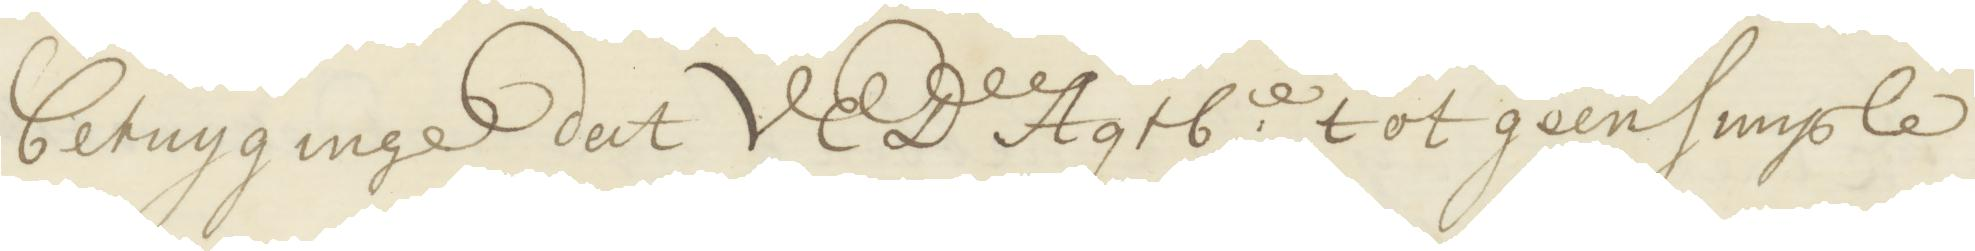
betuyginge dat VED:e Agtb:e tot geen Simple
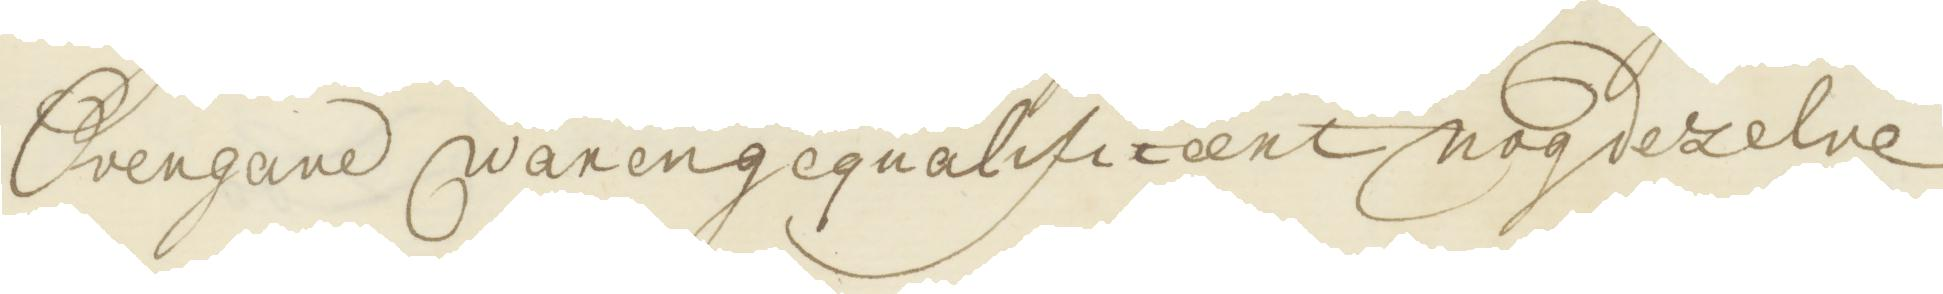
Overgave waren gequalificeert nog dezelve
